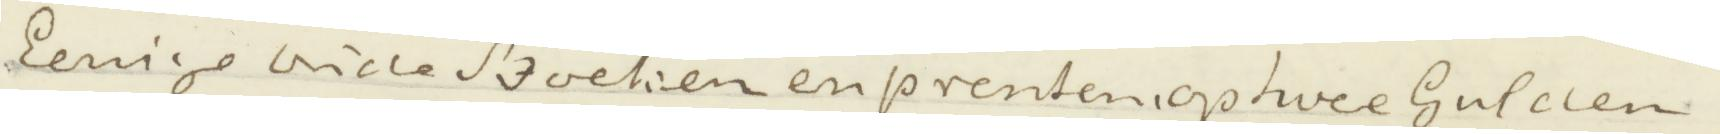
Eenige oude Boeken en prenten op twee Gulden
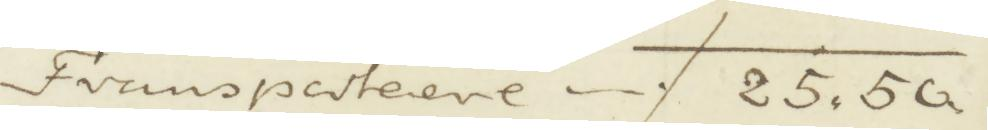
Transporteere – – ƒ 25„50
